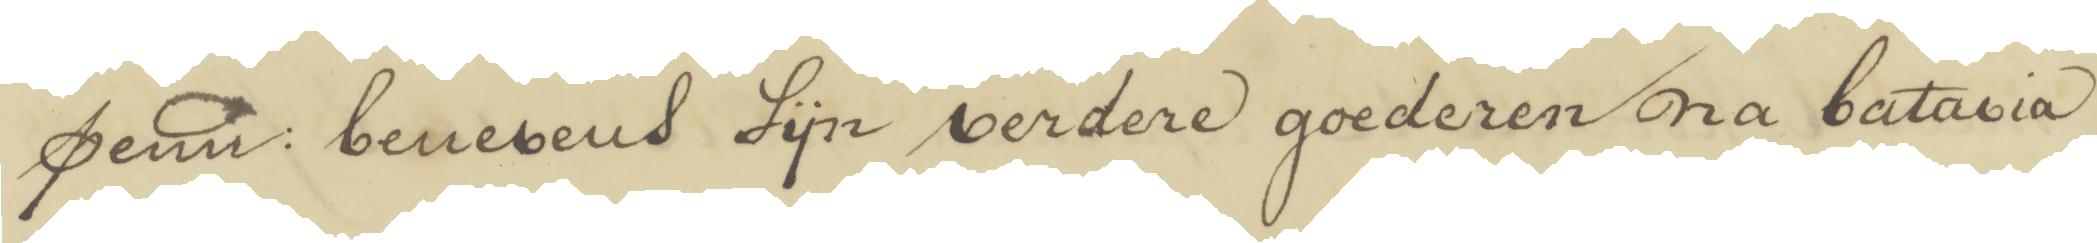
penn: benevens Sijn verdere goederen na batavia
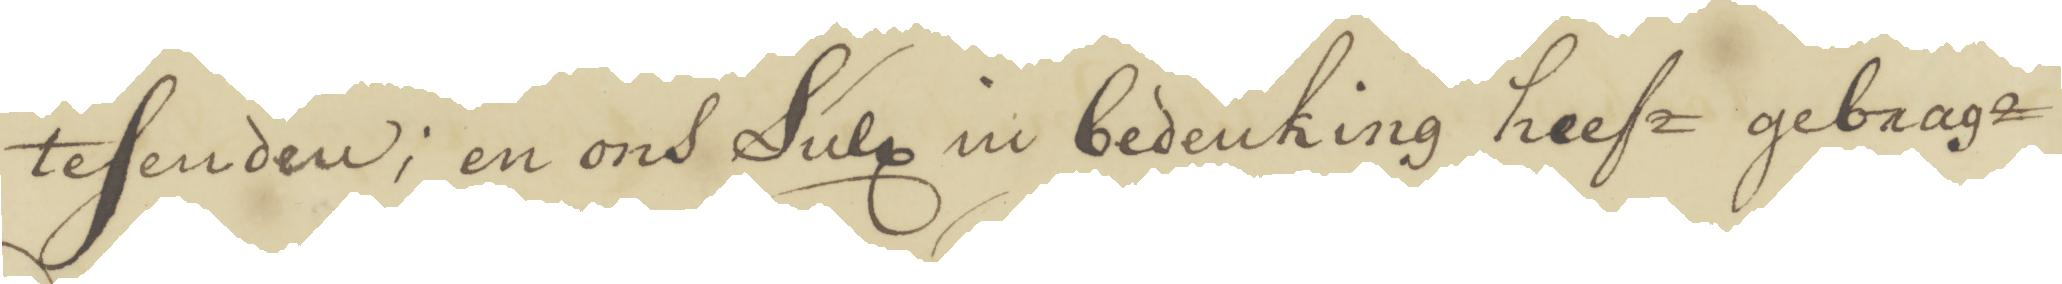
te Senden; en ons Sulx in bedenking heeft gebragt
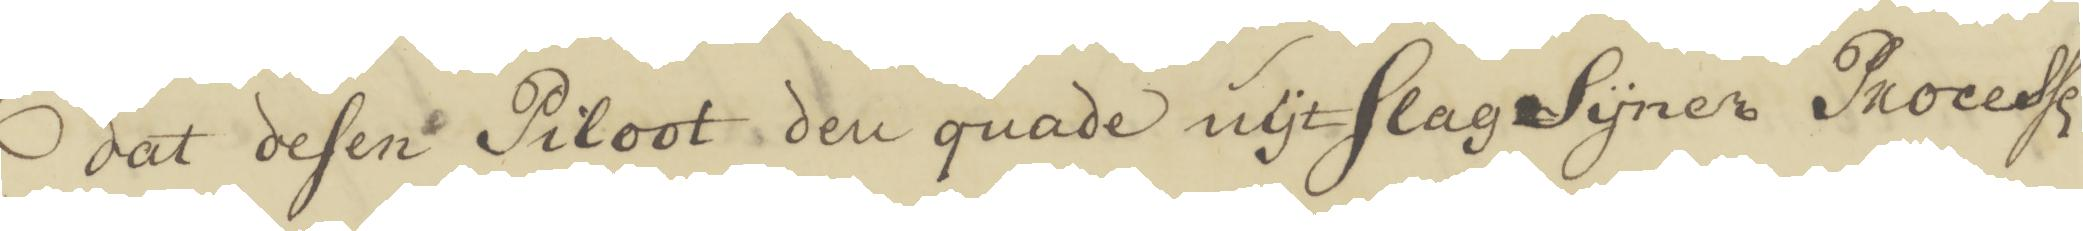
dat desen Piloot den quade uijtslag Sijner Processen
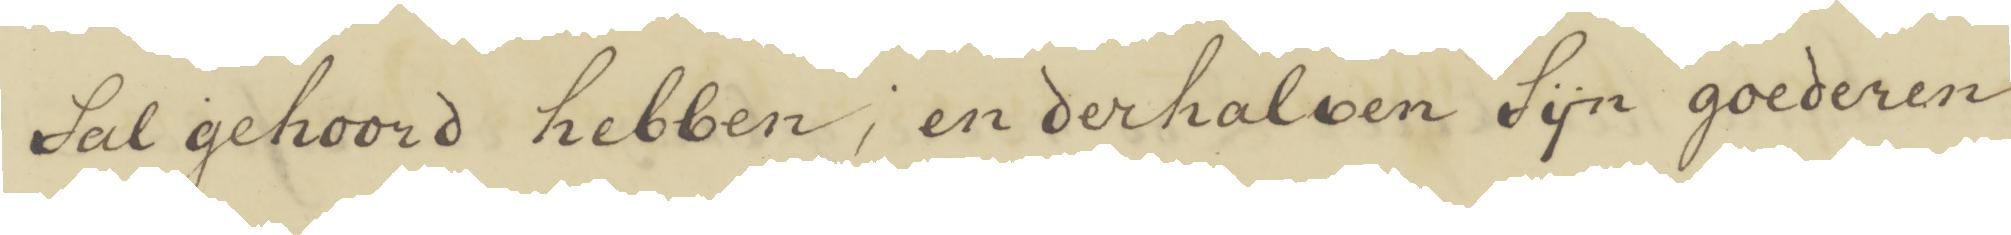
Sal gehoord hebben; en derhalven Sijn goederen
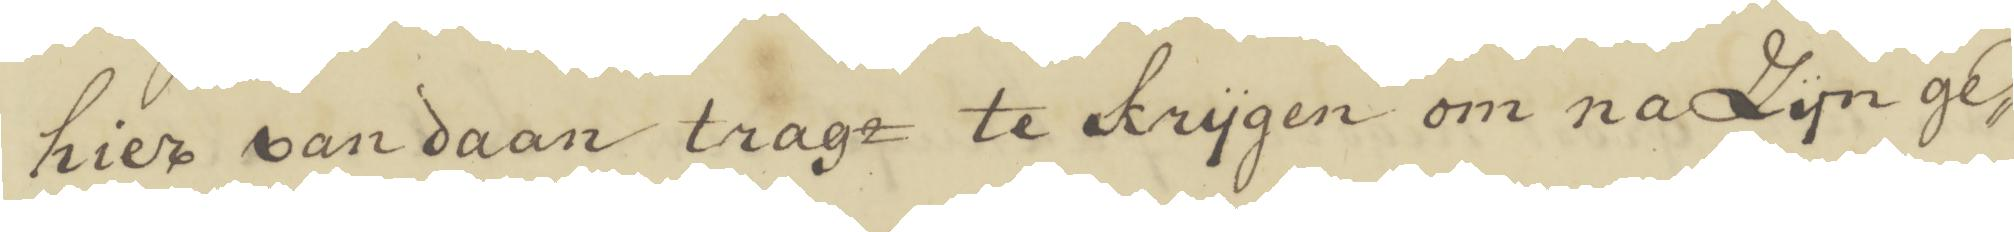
hier van daan tragt te krijgen om na Zijn ge
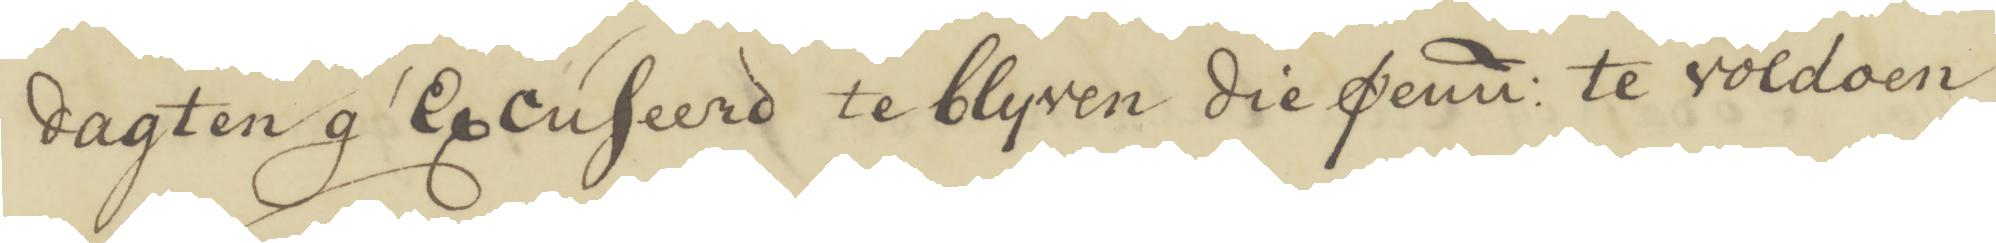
dagten g’Excuseerd te blyven die penn: te voldoen
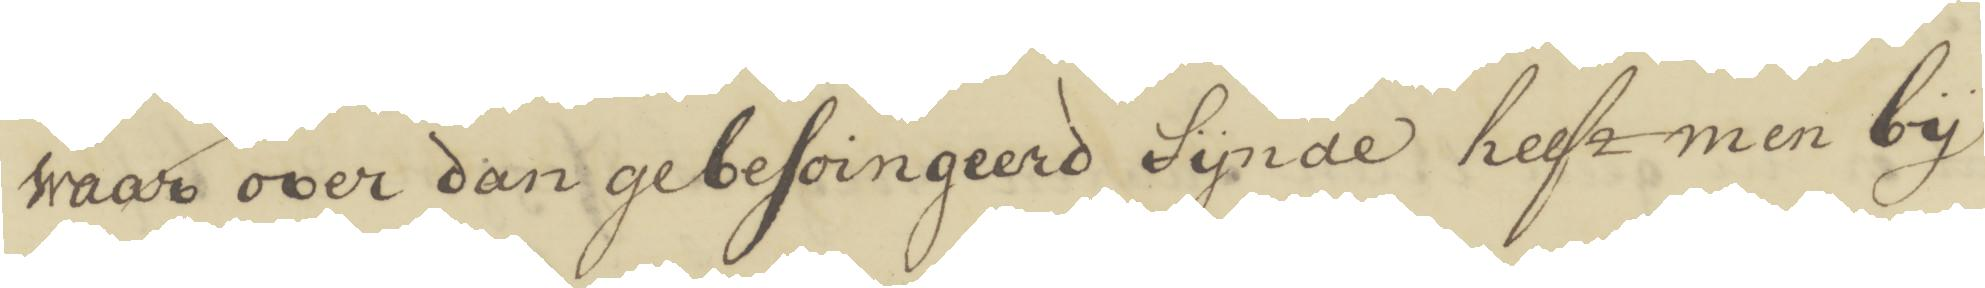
waar over dan gebesoingeerd Sijnde heeft men bij
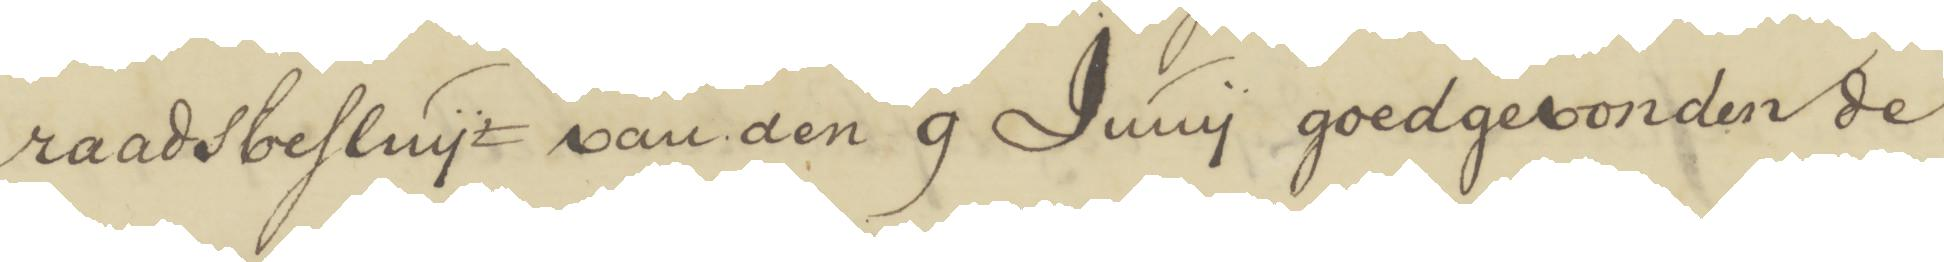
raads besluijt van den 9 Iunij goedgevonden de
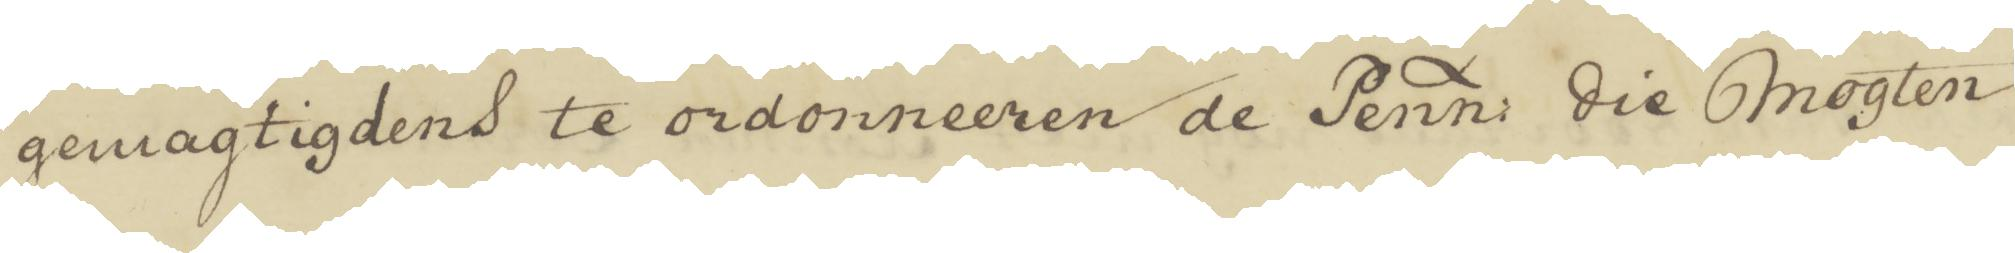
gemagtigdens te ordonneeren de Penn: die mogten
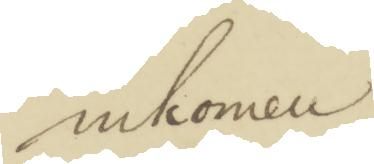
inkomen
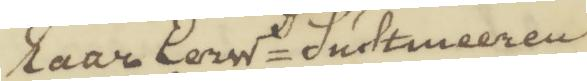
haar Eerw=s Sustineeren
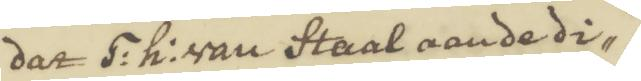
dat T: h: van Staal aan de di„
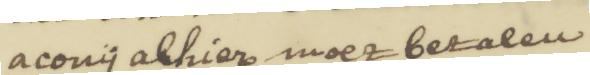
aconij alhier moet betalen
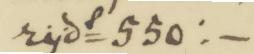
rijd=s 550:—
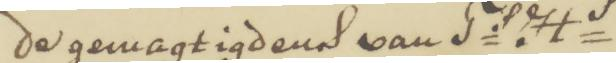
de gemagtigdens van T=s H=s
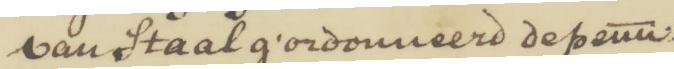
van staal g’ordonneerd de penn.
